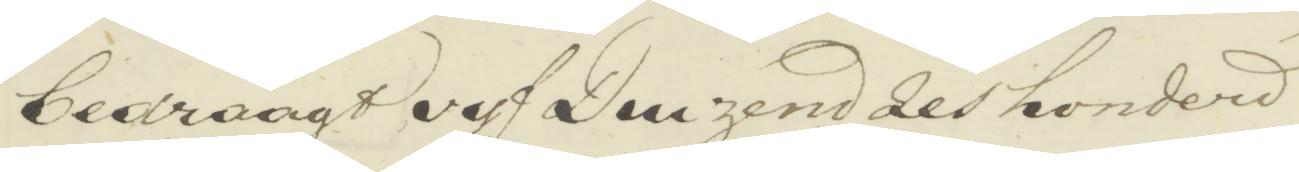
bedraagt vyf Duizend zes honderd
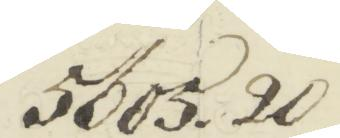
5605. 20
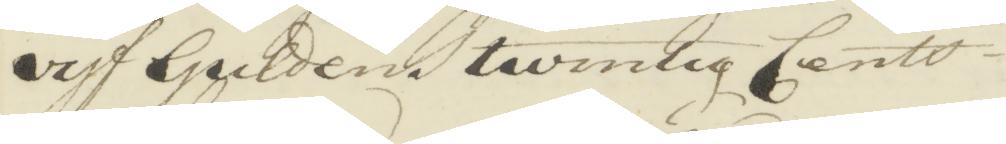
vyf Guldens twintig Cents -
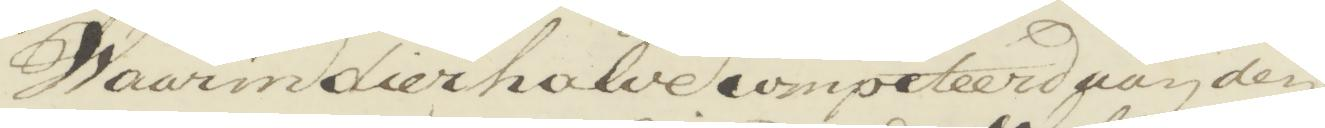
Waarin dierhalve competeerd aan den
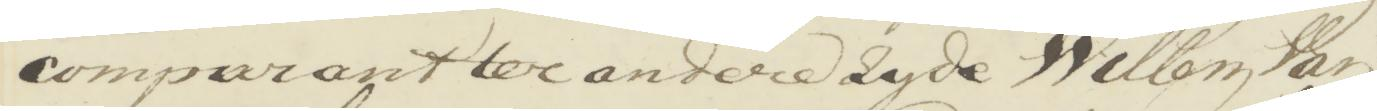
comparant ter andere zyde Willem Van
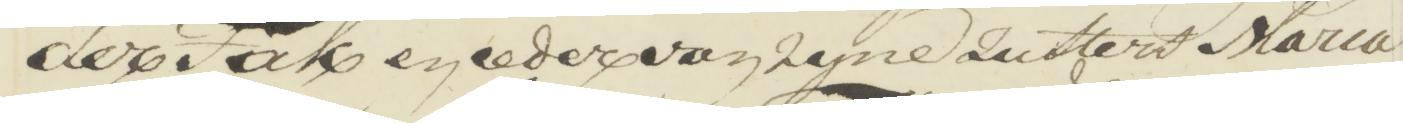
der Tak en ieder van zyne zusters Maria
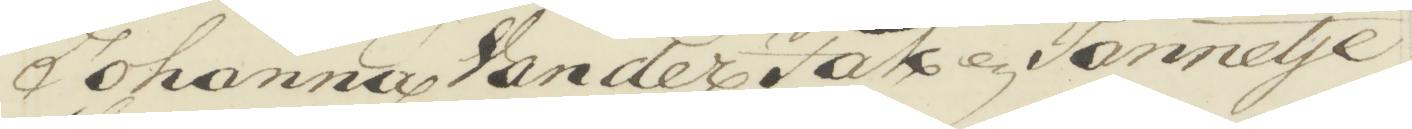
Johanna Van der Tak en Sannetje
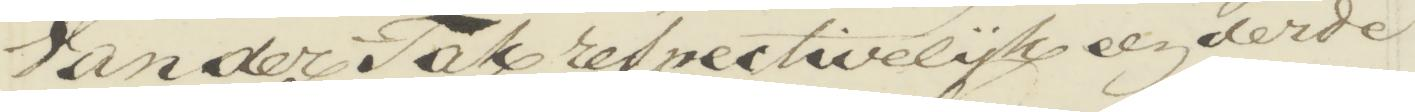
Van der Tak respectivelijk een derde
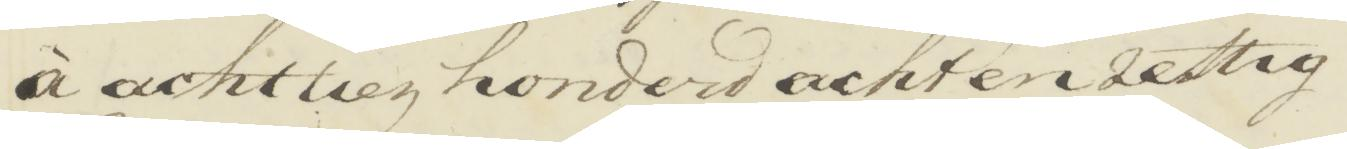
à achttien honderd acht en zestig
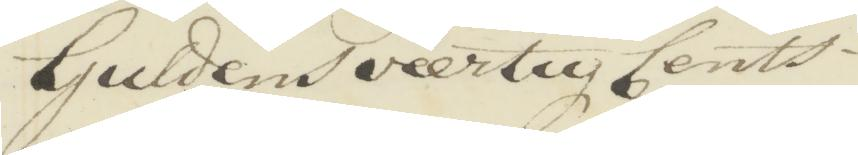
Guldens veertig Cents
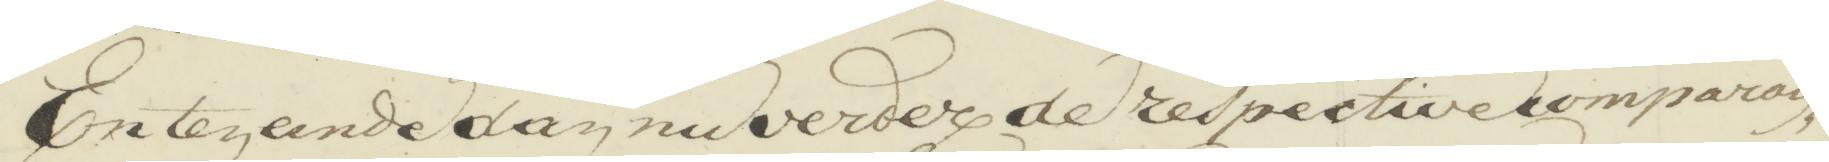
En ten einde dan nu verder de respective comparan„
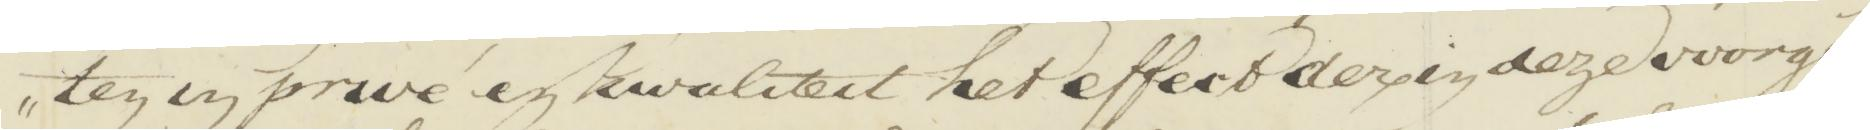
„ten in privé en kwalieit het effect der in deze voorge„
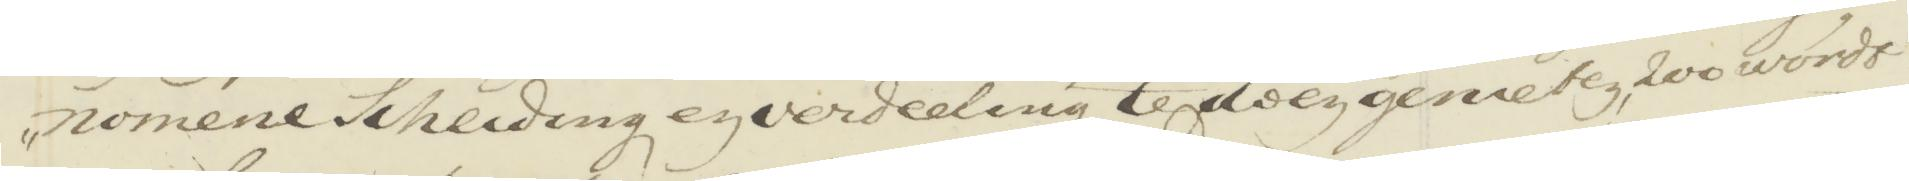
„nomene scheiding en verdeeling te doen genieten, zoo wordt
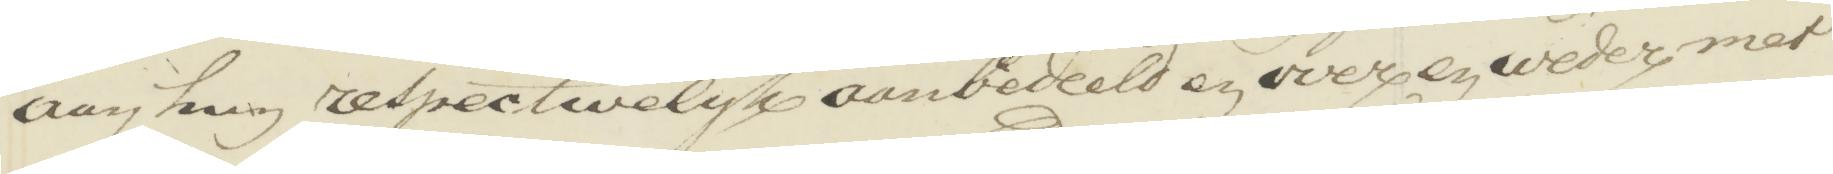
aan hun respectivelyk aanbedeeld en over en weder met
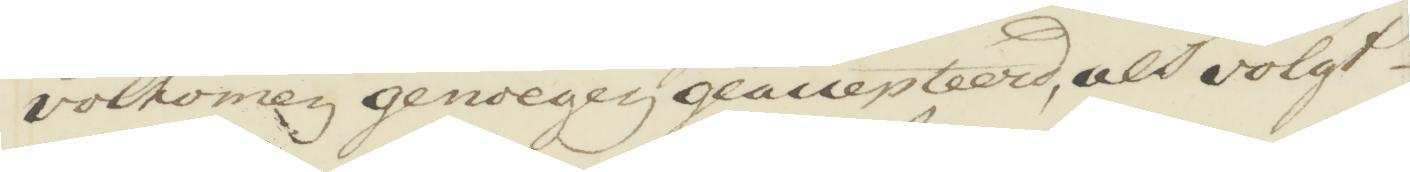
volkomen genoegen geaccepteerd, als volgt-
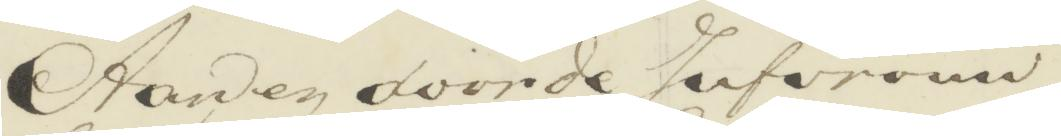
Aan en door de Jufvrouw
